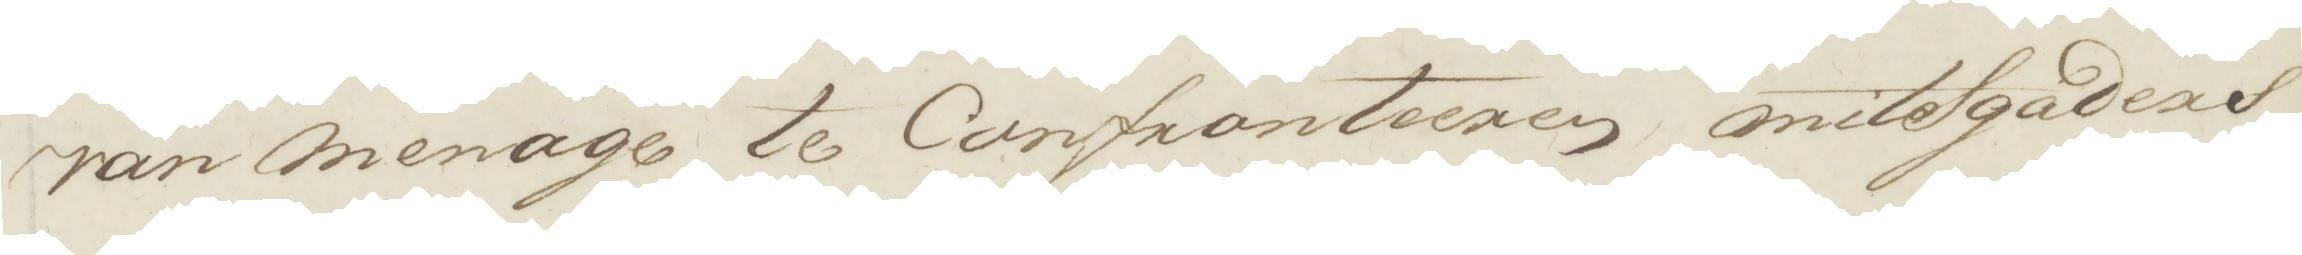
van menage te Confronteeren, mitsgaders
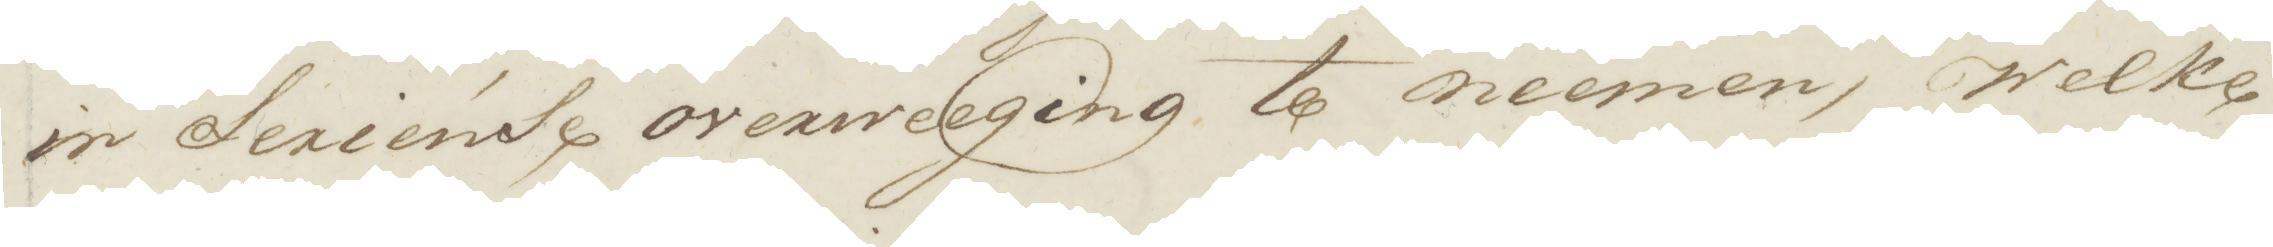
in serieuse overweeging te neemen, welke
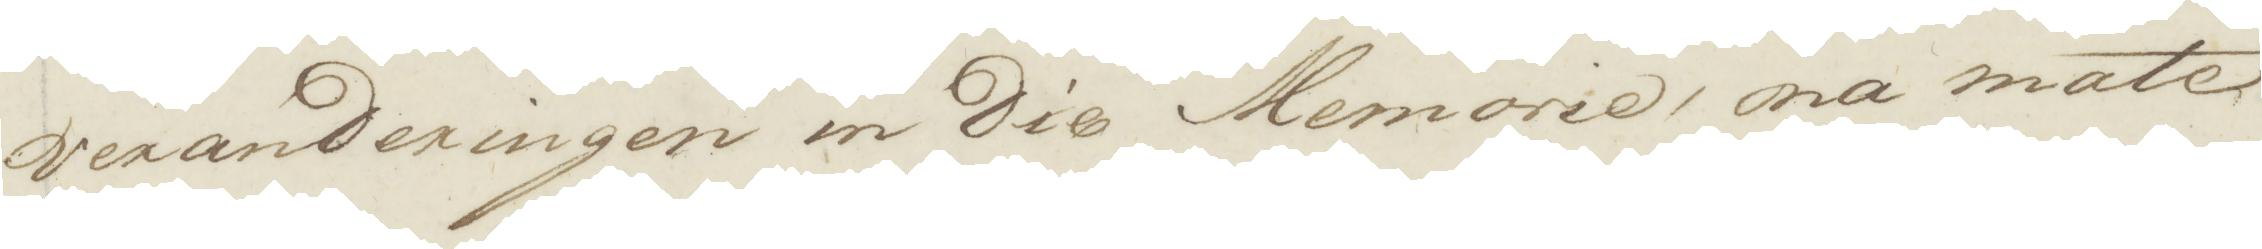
veranderingen in die Memorie, na mate
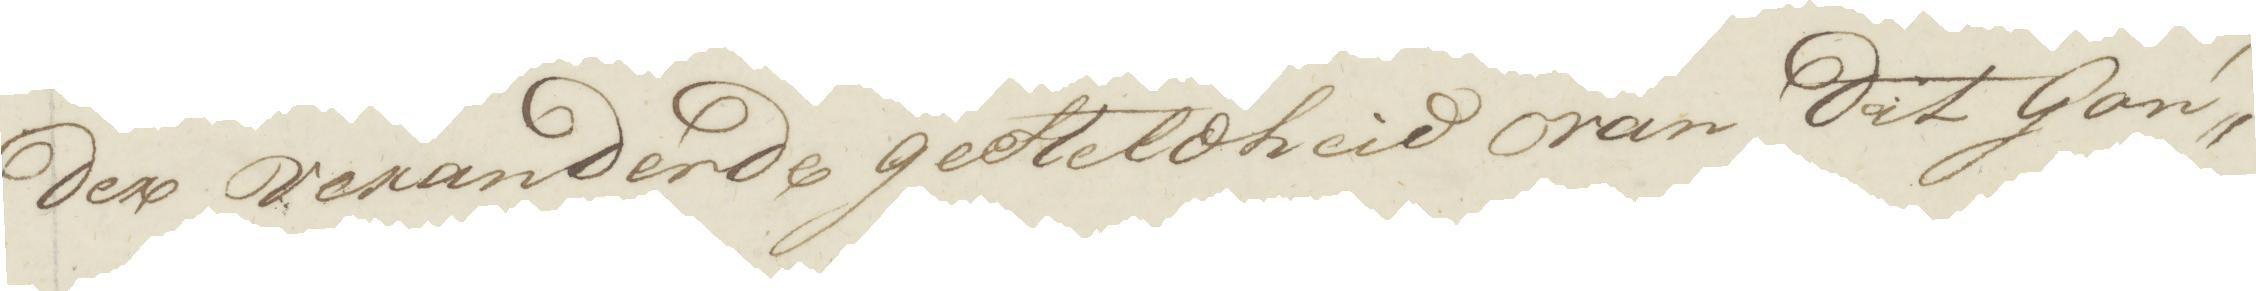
der veranderde gesteldheid van dit Gou„
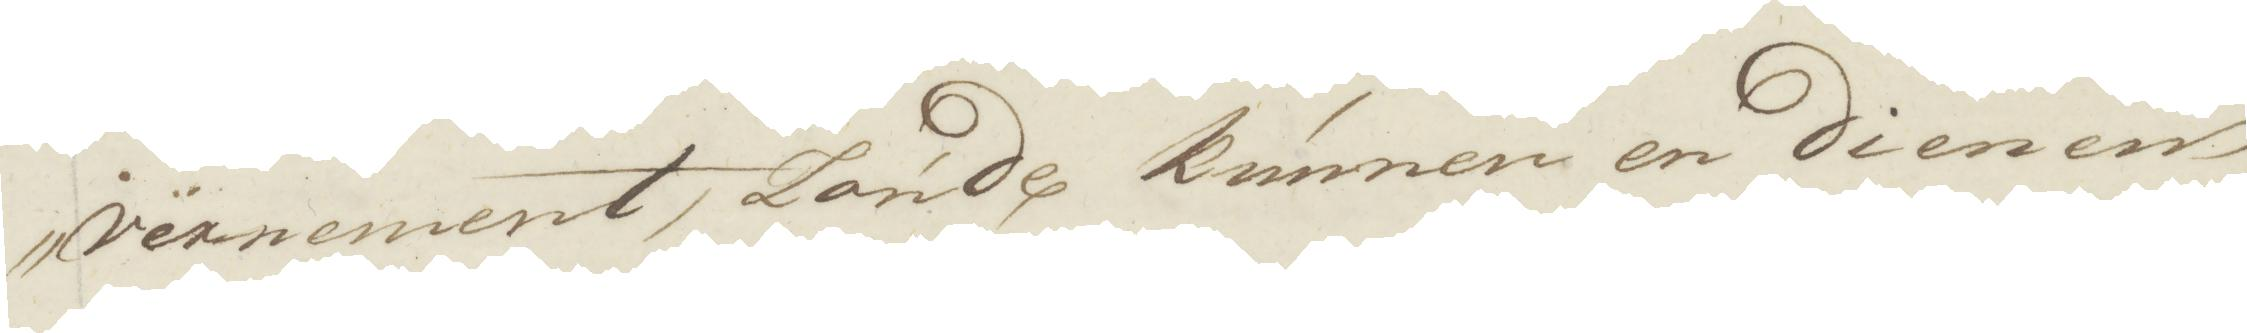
„vernement, zoude kunnen en dienen
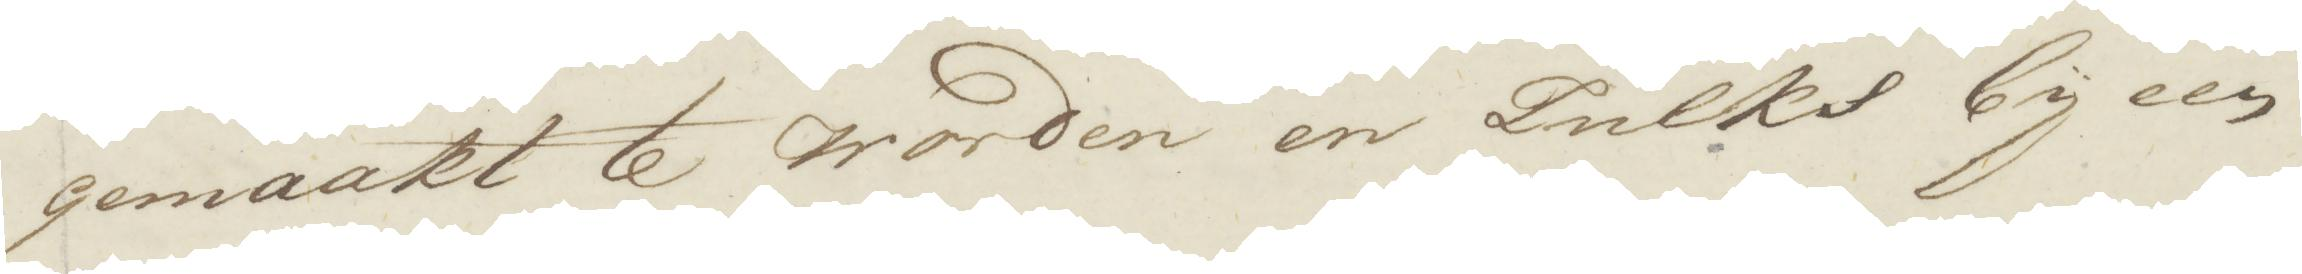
gemaakt te worden en zulks bij een
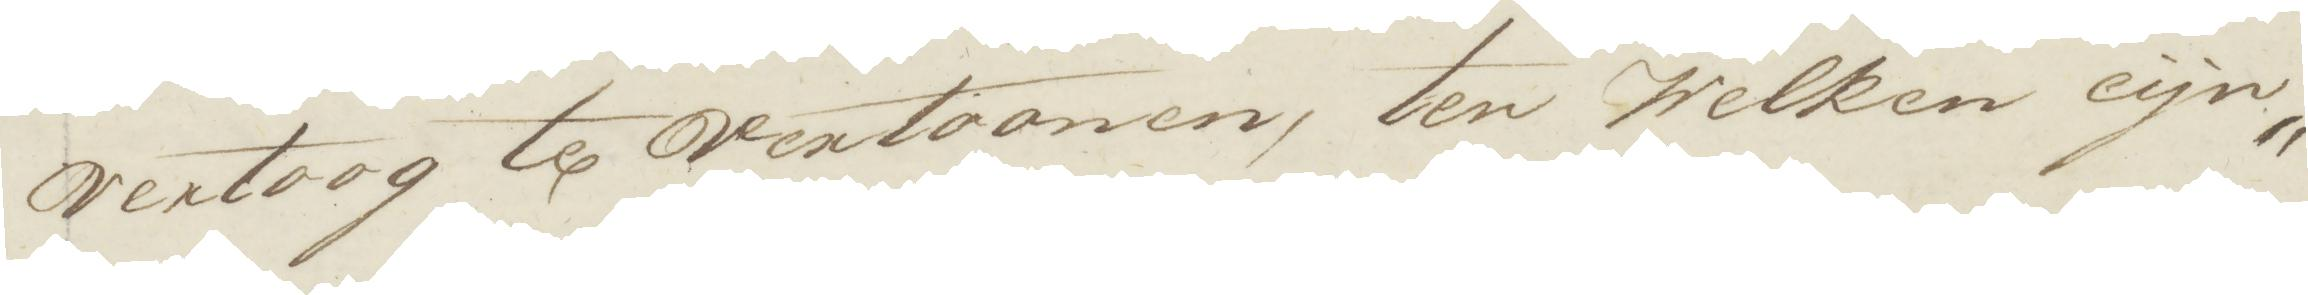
vertoog te vertoonen, ten welken eijn„
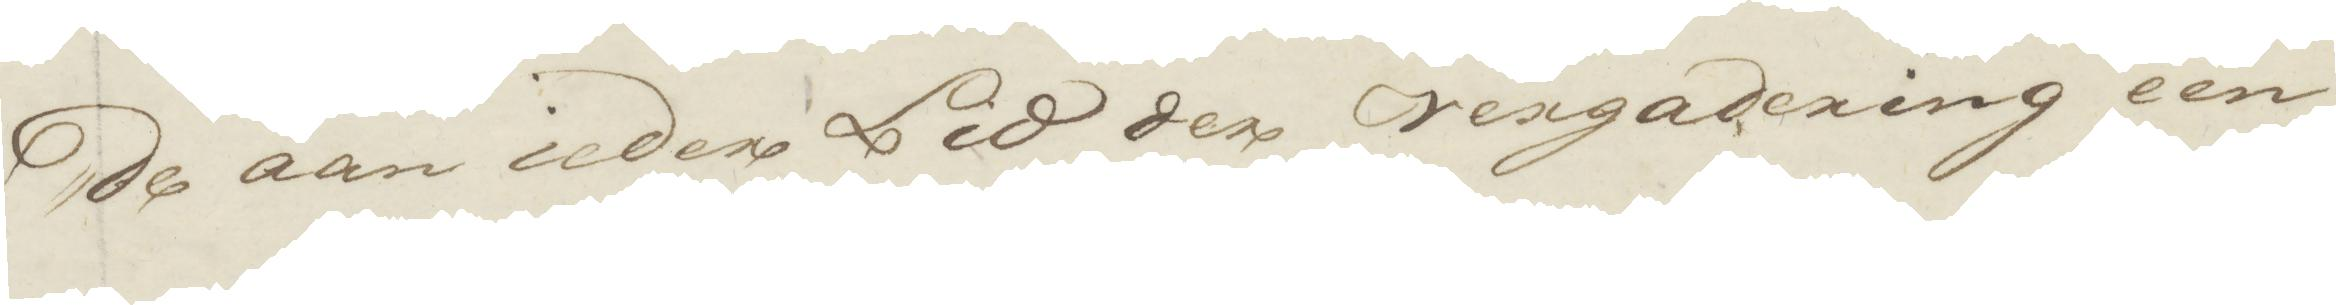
„de aan ieder Lid der vergadering een
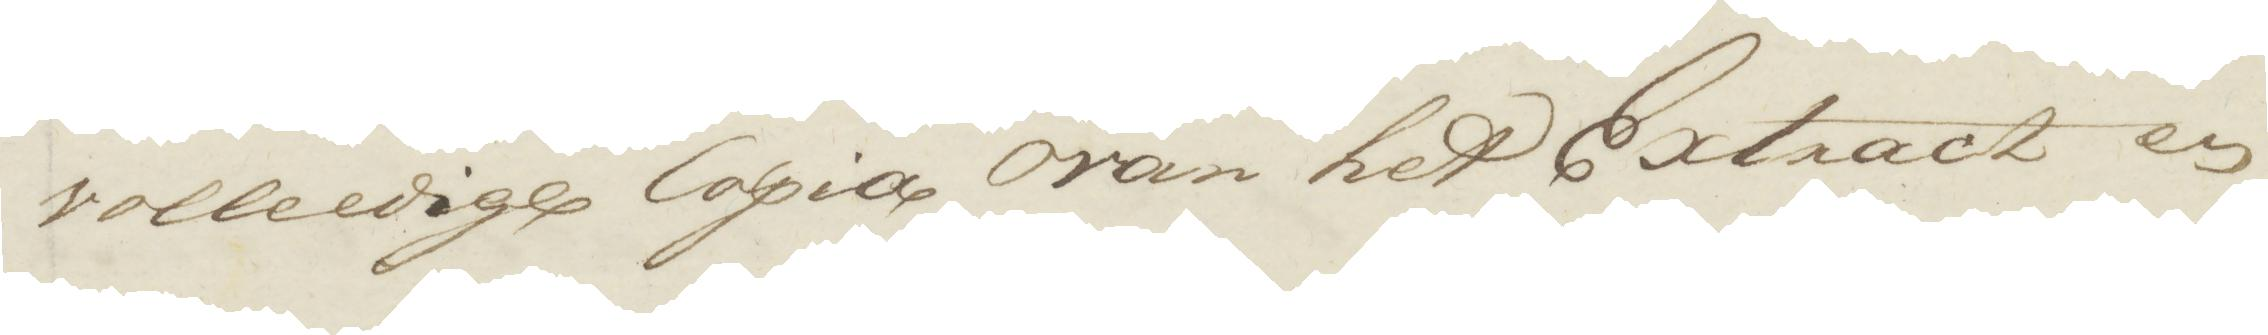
volleedige Copia van het Extract en
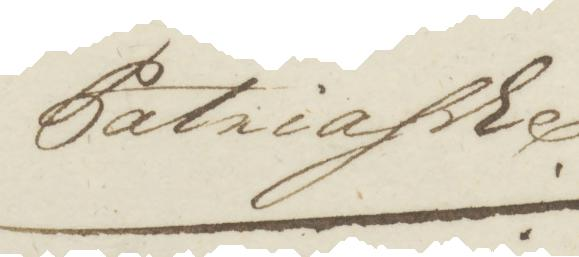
Patriasche
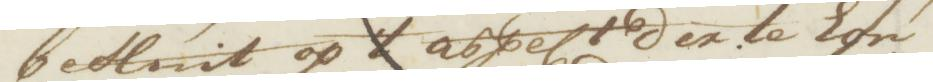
besluit op ’t aspect der te hou
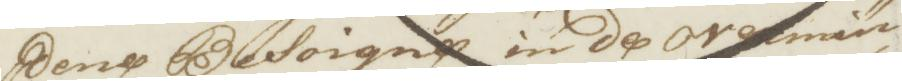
dene Besoigne in de overmin
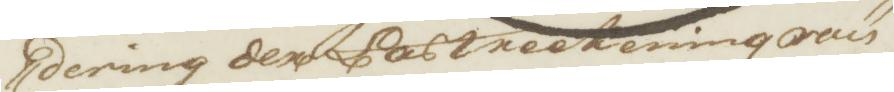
dering der Lastreekening van
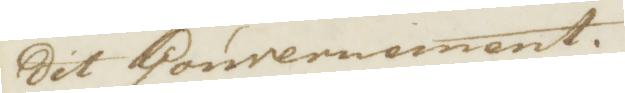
dit Gouvernement.
